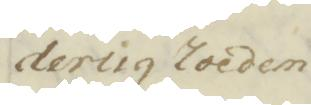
dertig roeden
